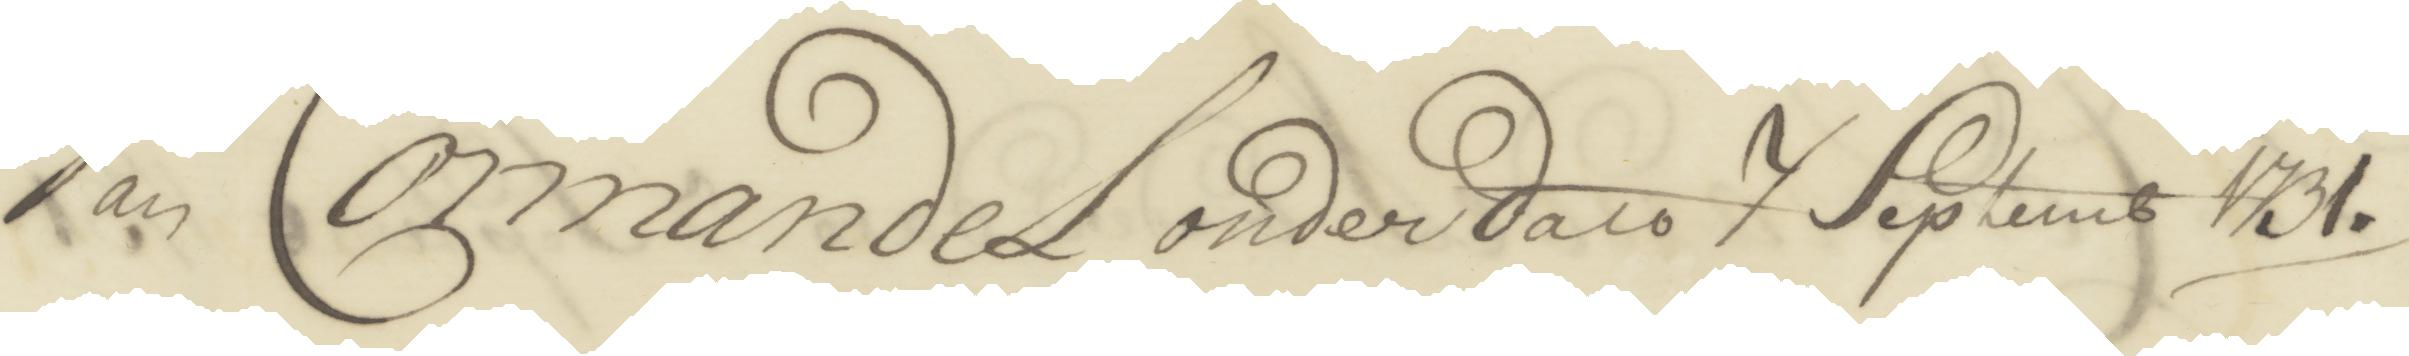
Van Cormandel onder dato 7 Septemb 1731.
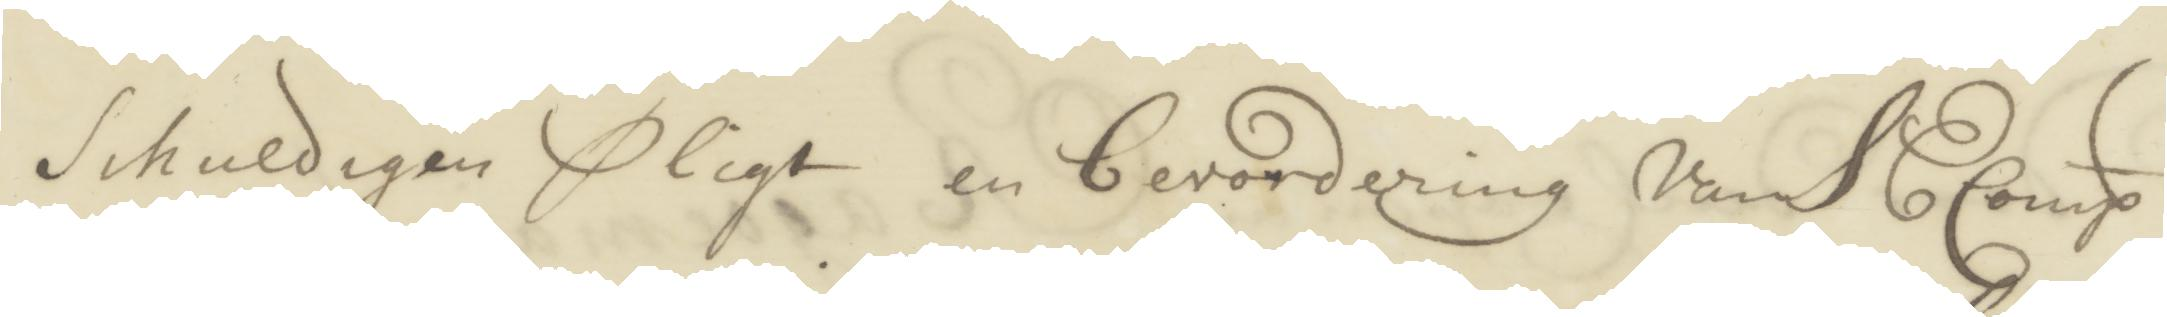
schuldigen pligt en bevordering van SE Comp
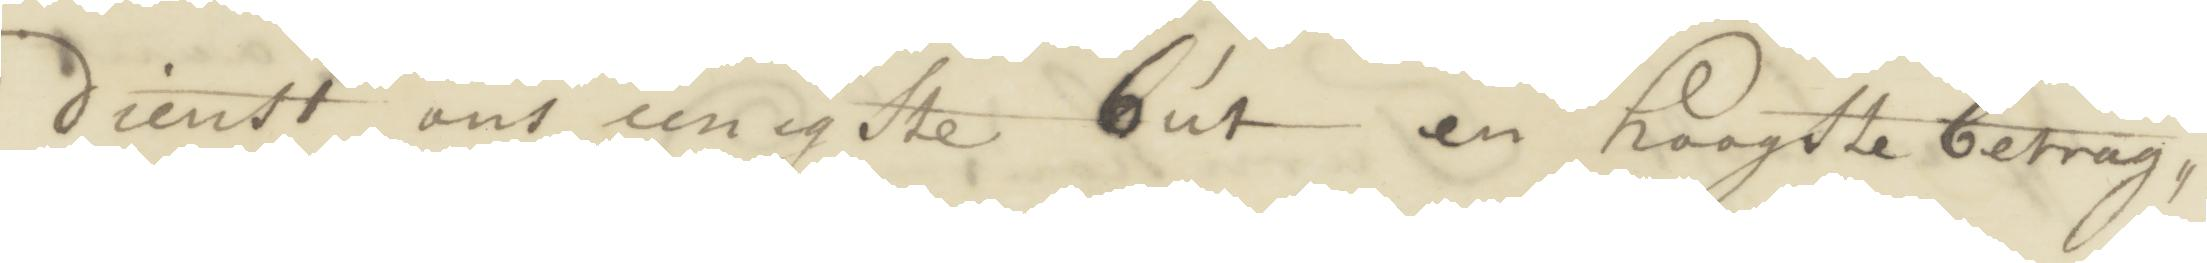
dienst ons eenigste but en hoogste betrag„
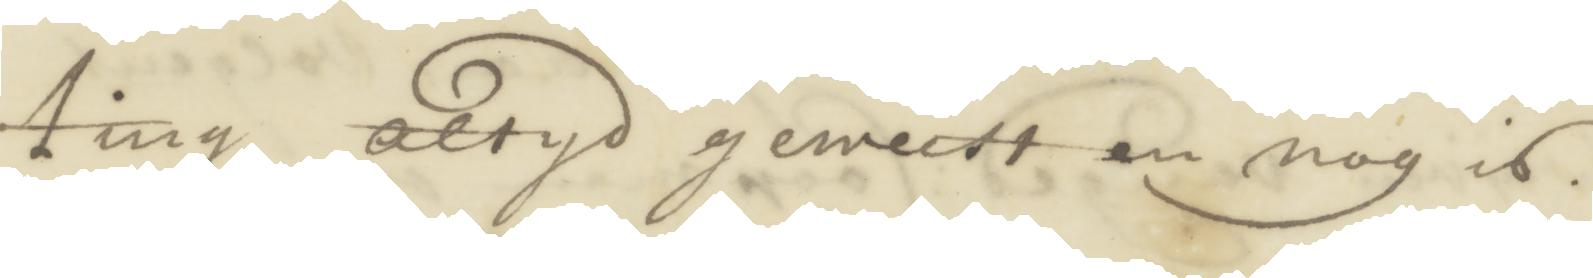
ting altyd geweest en nog is.
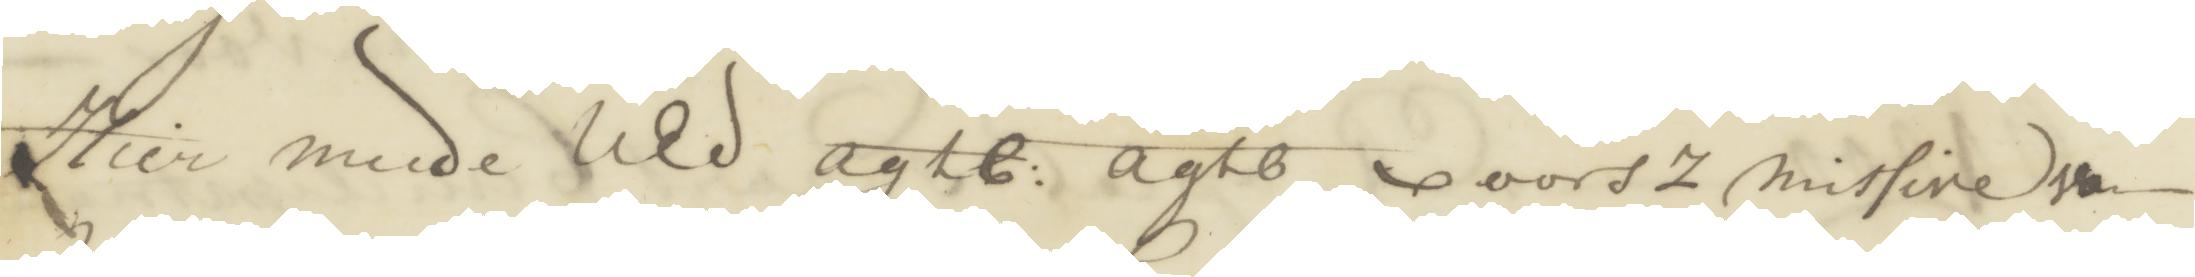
Hier meede UEd agtb: agtb voorsz missive van
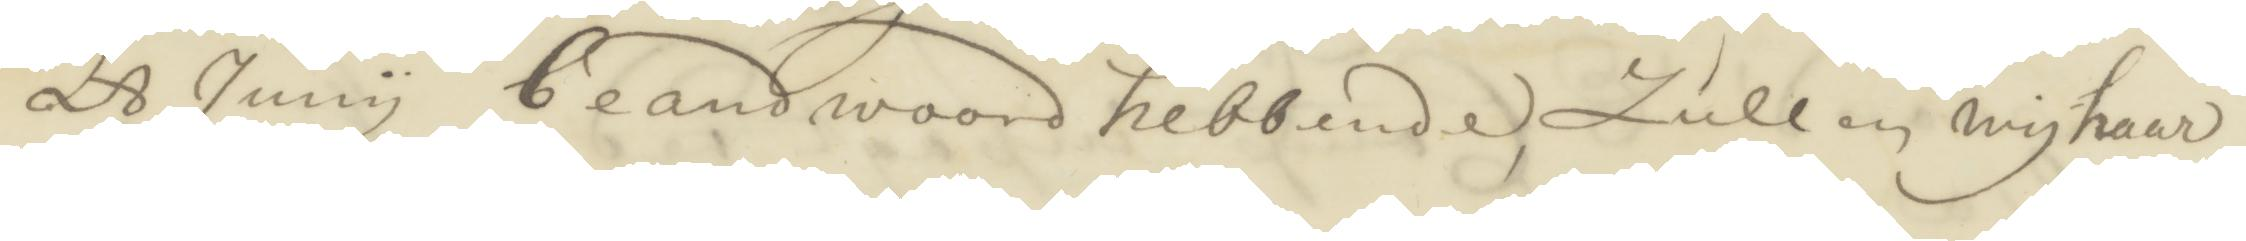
28 Junij beandwoord hebbende zullen wij haar
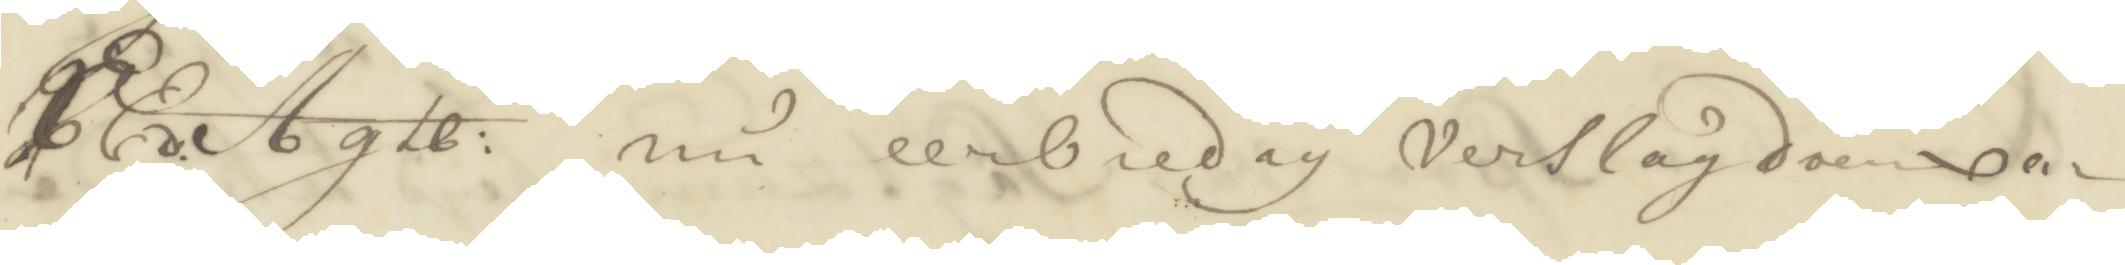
EEd: Agtb: nu eerbiedig verslag doen van
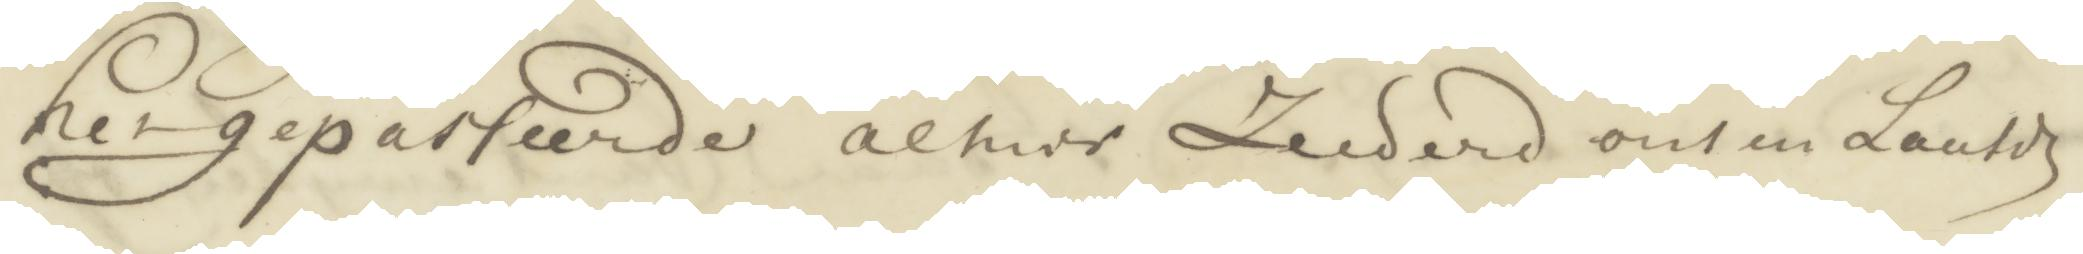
het gepasseerde alhier zeederd ons en Laaten
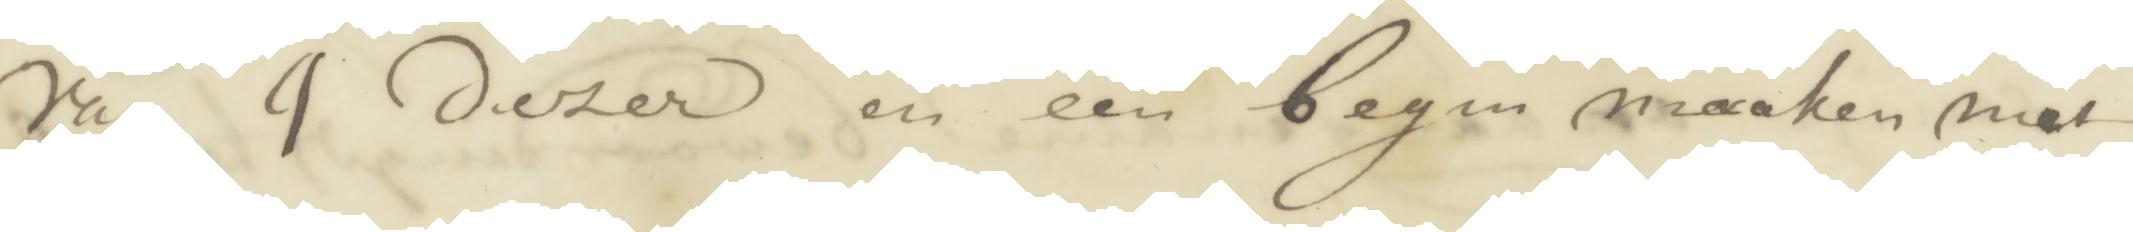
van 4 dezer en een begin maaken met
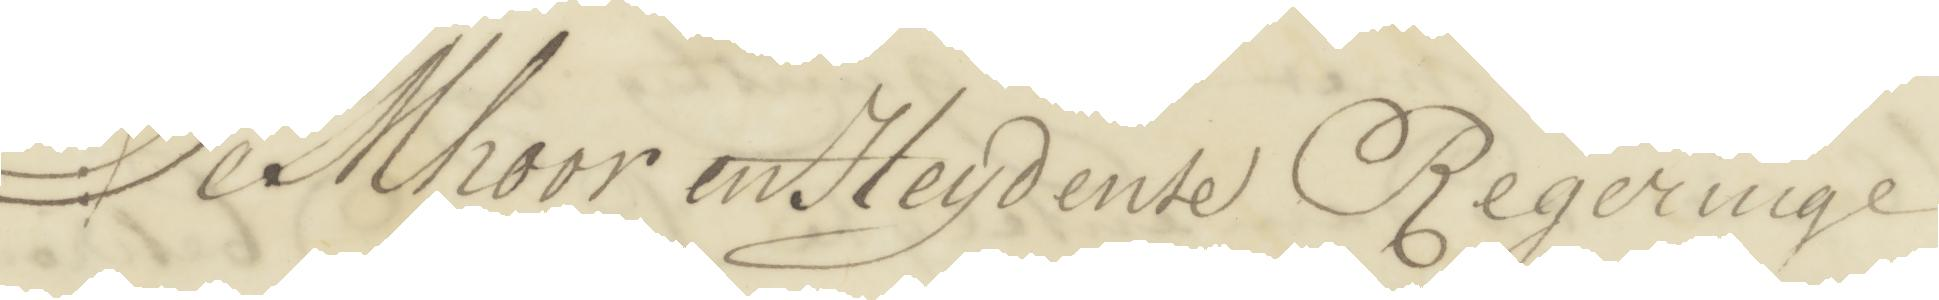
De Mhoor en Heydense Regeringe
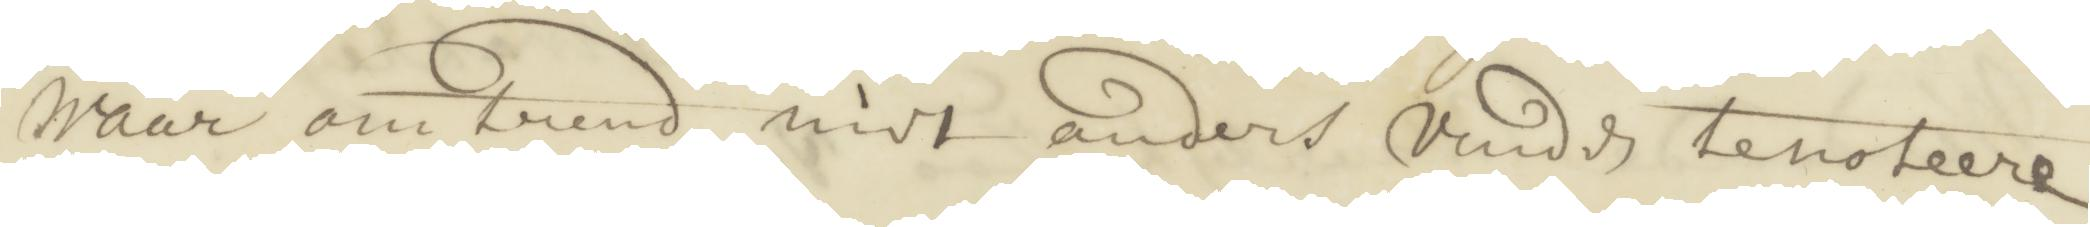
waar omtrend niet anders vinden tenoteeren
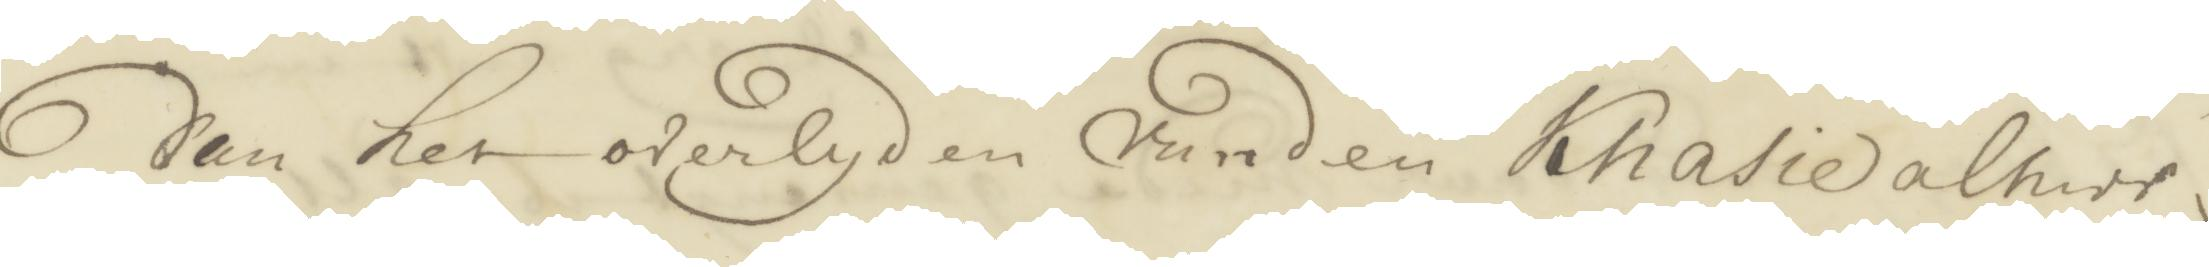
van het overlyden van den Khasie alhier
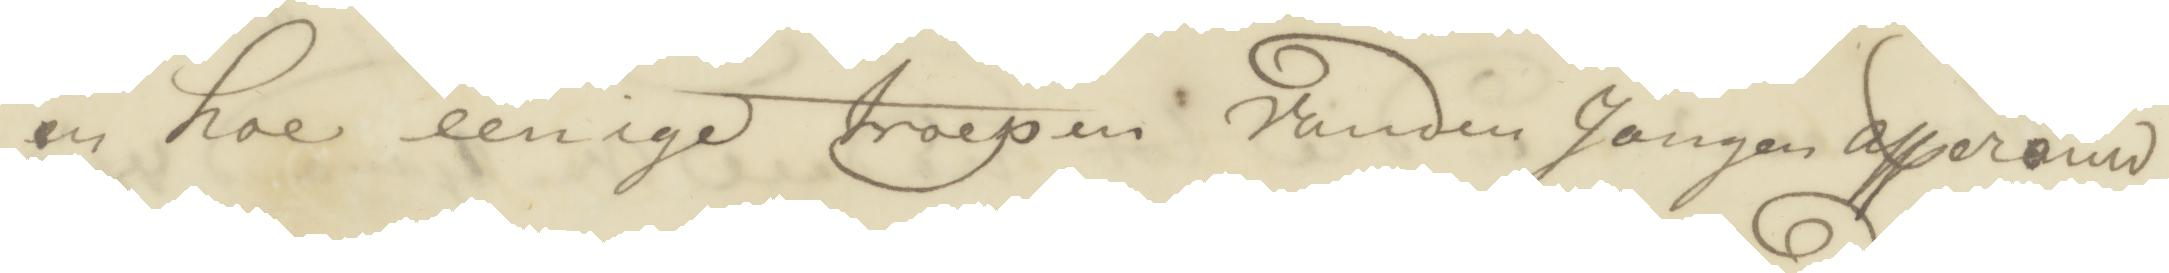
en hoe eenige troepen van den Jongen apperouw
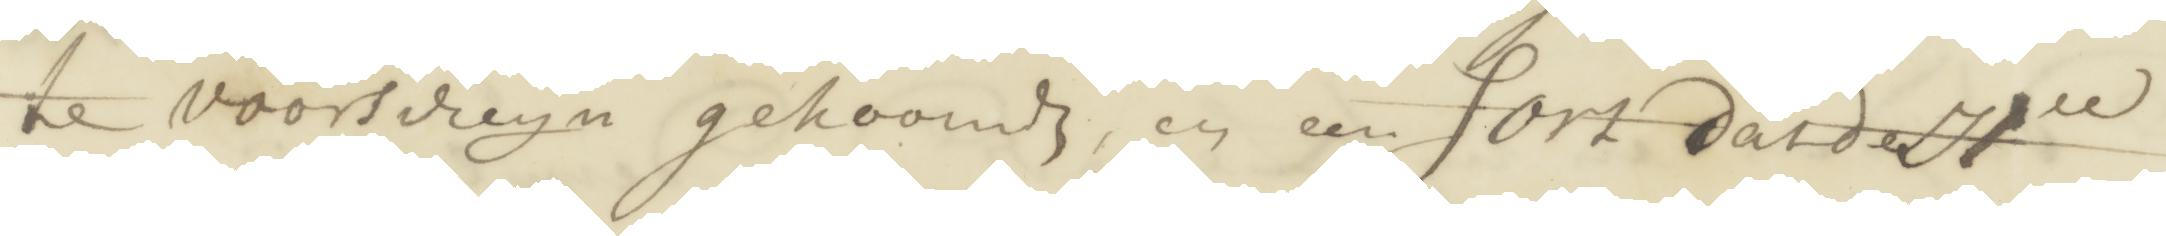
te voorscheyn gekoomen, en een fort dat de Hn
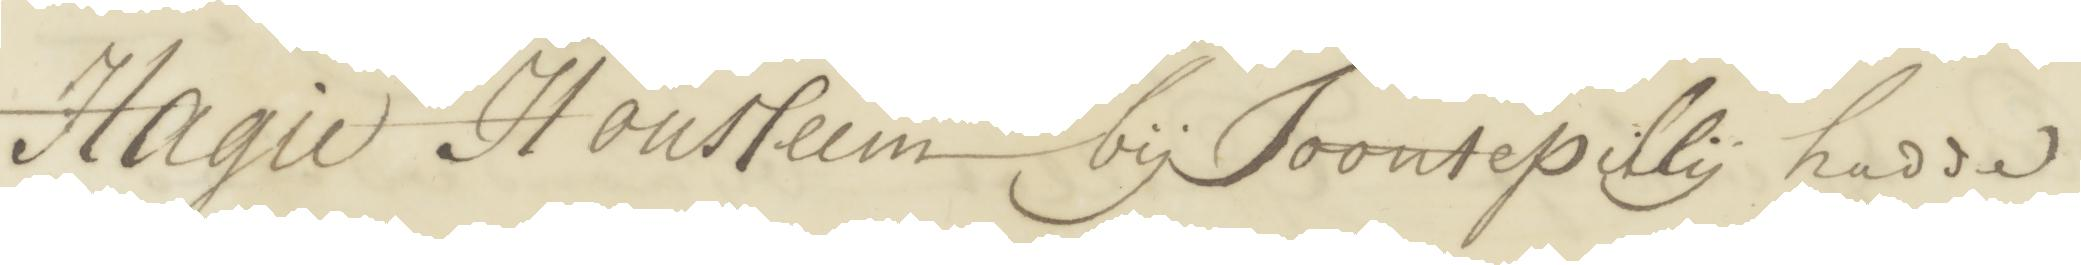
Hagie Housseem bij Toontepillij hadde
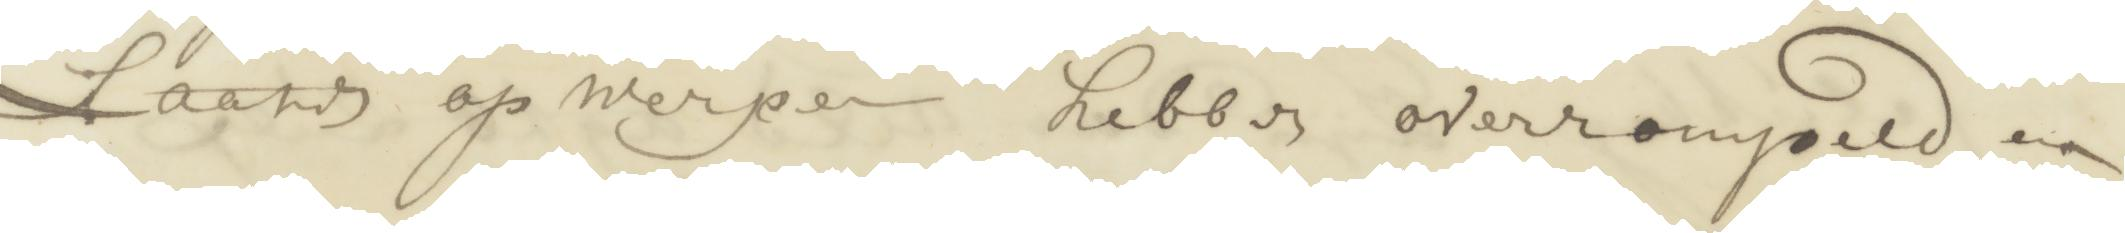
Laaten op werpen hebben overrompeld, en
